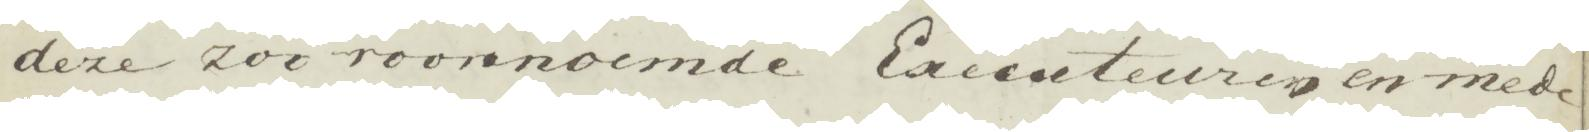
deze zoo voornoemde Executeuren en mede
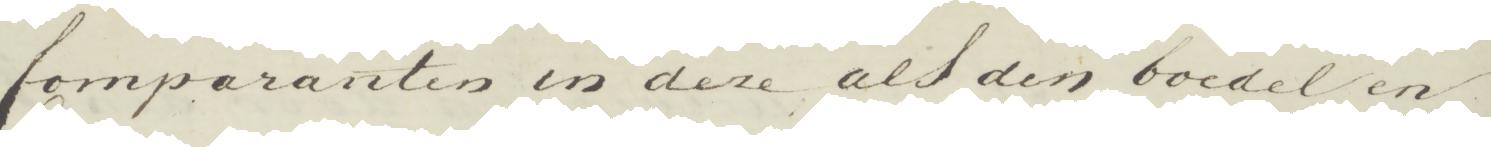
Comparanten in deze als den boedel en
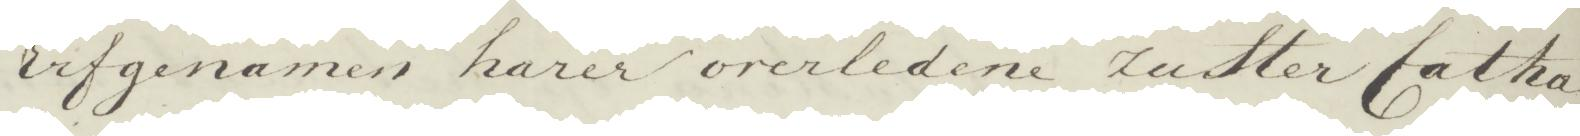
Erfgenamen harer overledene zuster Catha
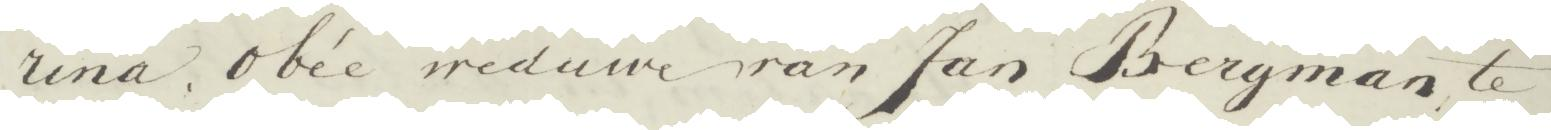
rina, Obée weduwe van Jan Bergman, te
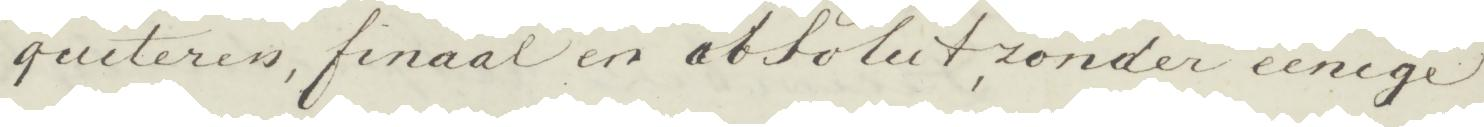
quiteren, finaal en absolut, zonder eenige
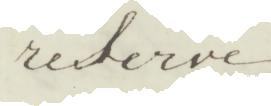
reserve.
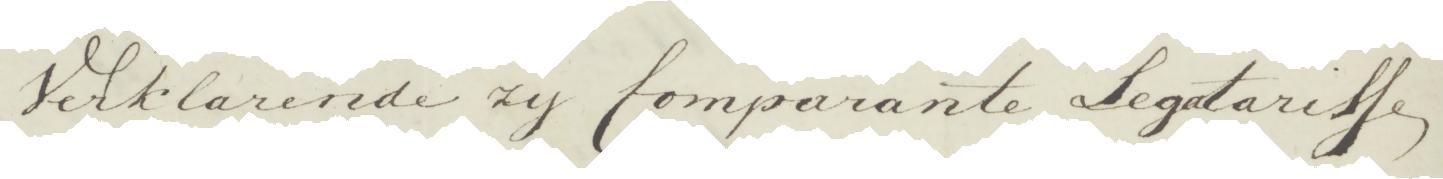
Verklarende zy Comparante Legatarisse
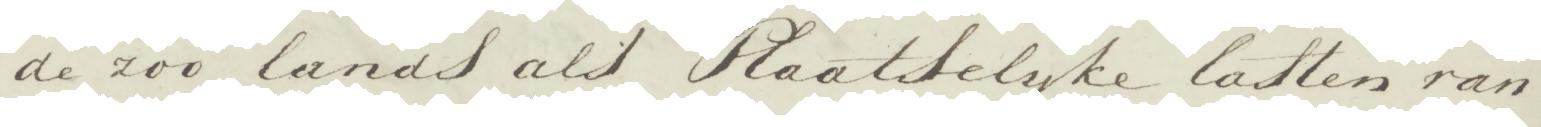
de zoo lands als Plaatselyke lasten van
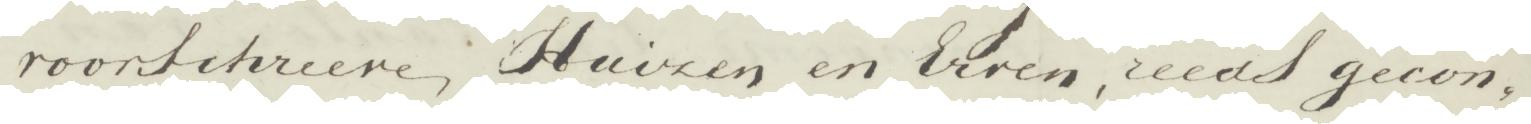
voorschreeve, Huizen en Erven, reeds gecon„
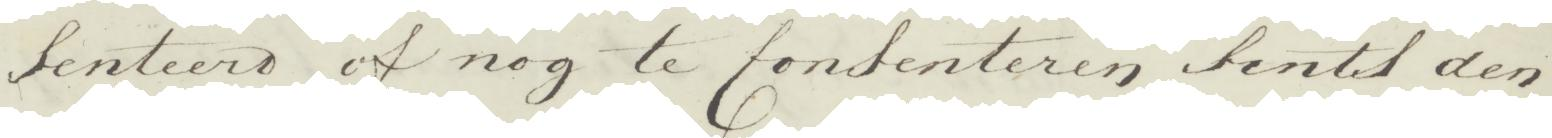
=senteerd of nog te consenteren, sints den
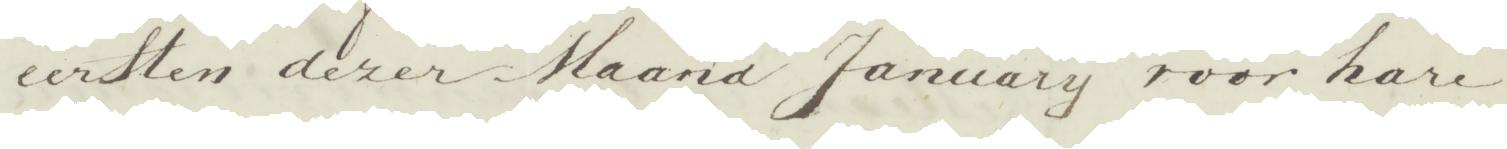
eersten dezer Maand January voor hare
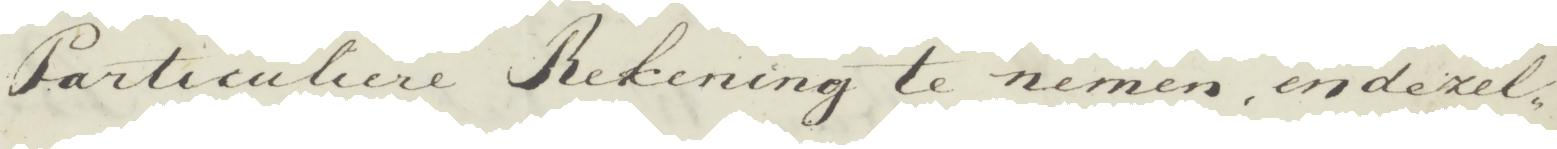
Particuliere Rekening te nemen, en dezel„
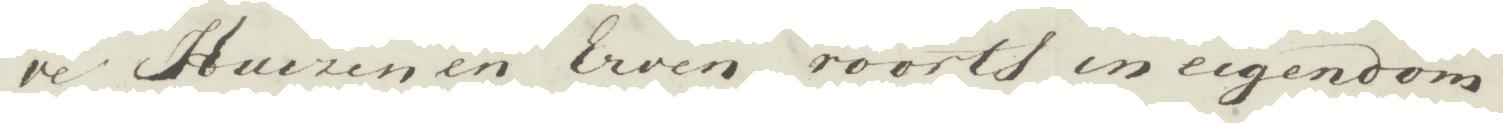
=ve Huizen en Erven voorts in eigendom
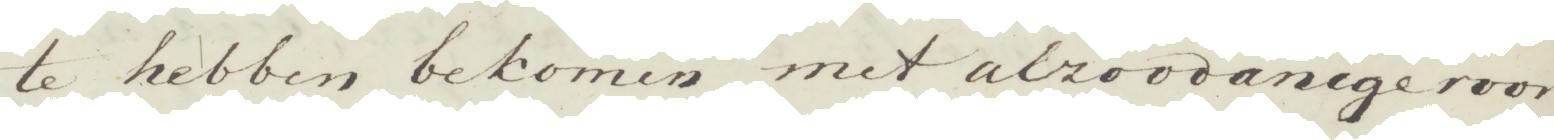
te hebben bekomen met alzoodanige voor
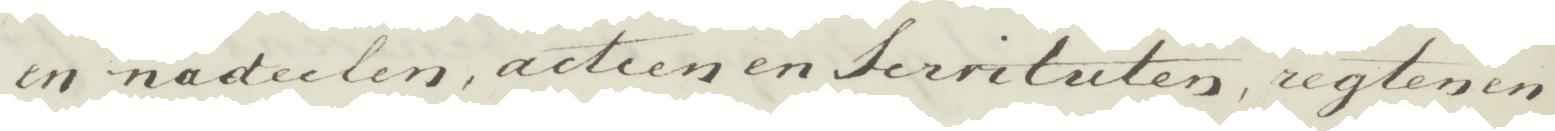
en nadeelen, actien en servituten, regten en
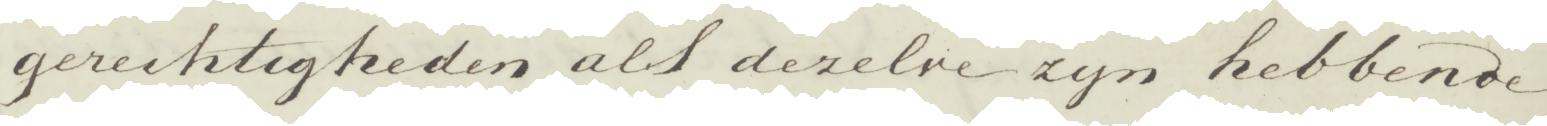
gerechtigheden, als dezelve zyn hebbende
